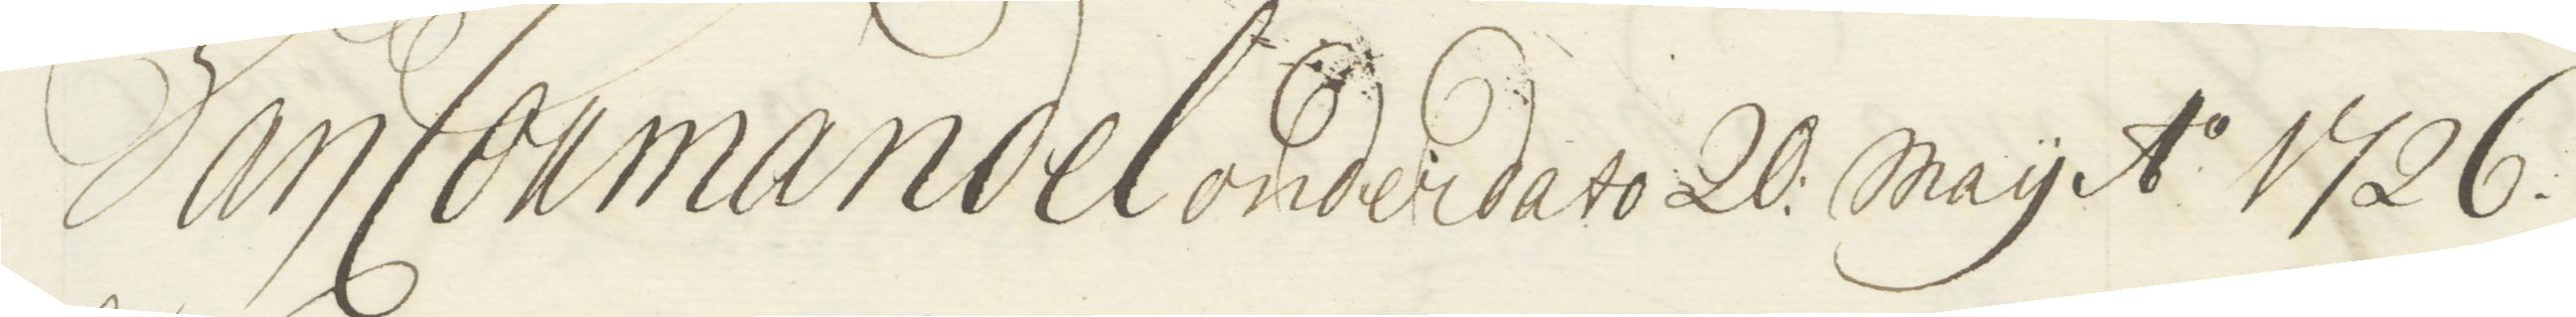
Van Cormandel onderdato 20: Maij A=o 1726.
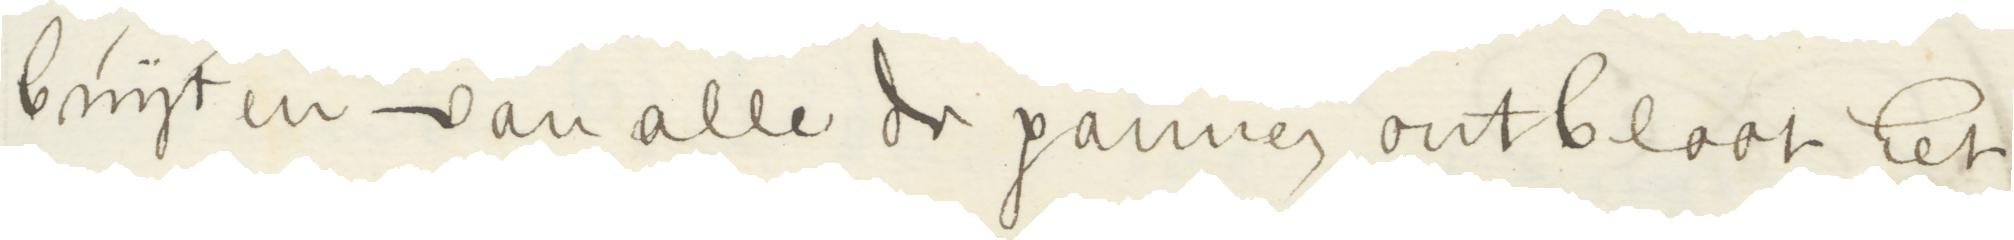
buijt en van alle de pannen ontbloot het
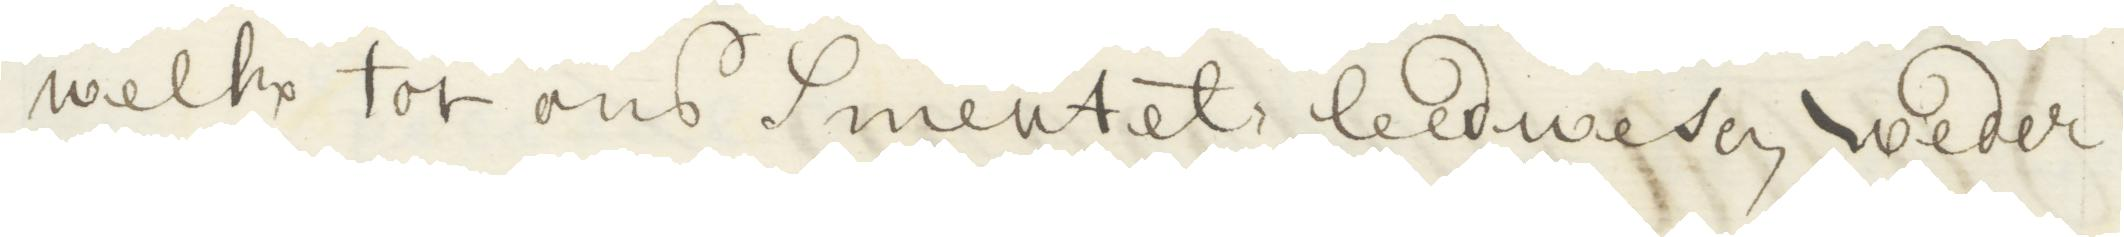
welk tot ons smertel: leedwesen weder
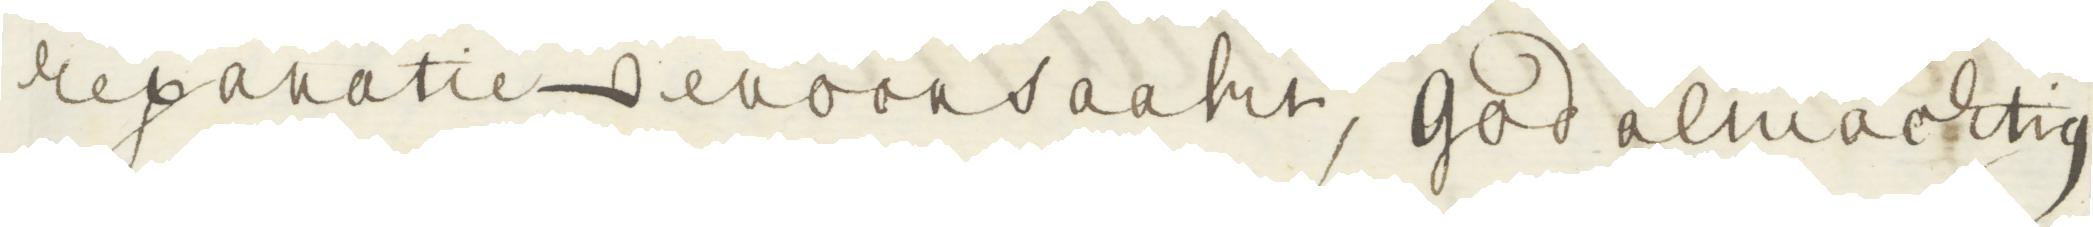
reparatie veroorsaakt, God almachtig
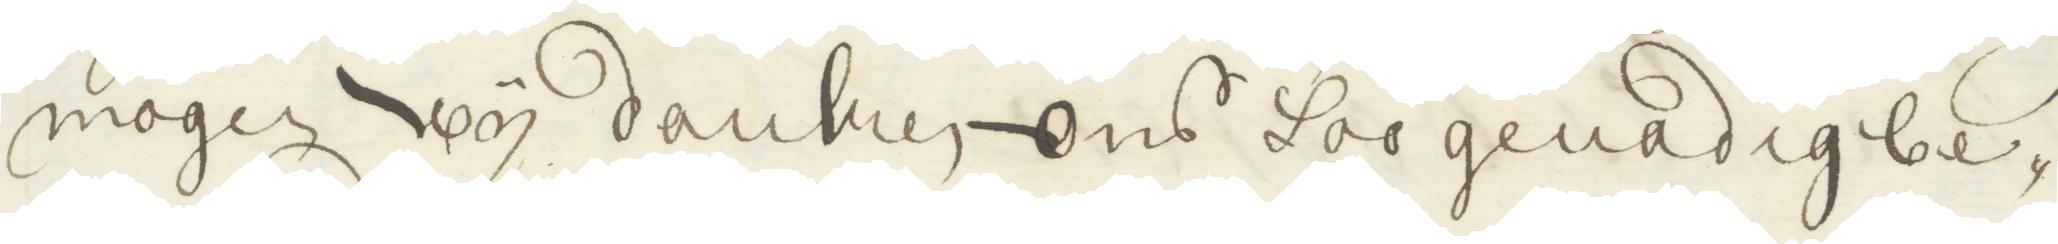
mogen wij danken ons soo genadig be„
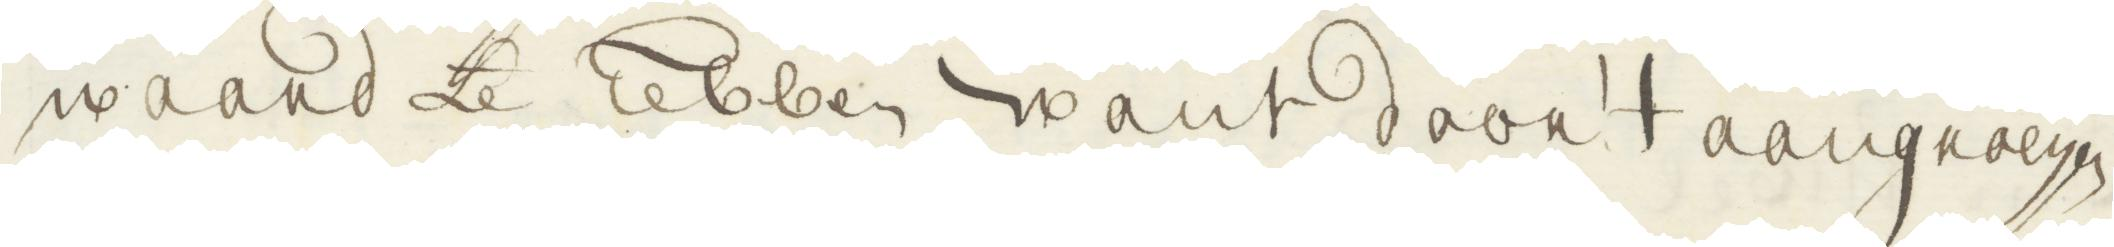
waard te hebben want door ’t aangroeijen
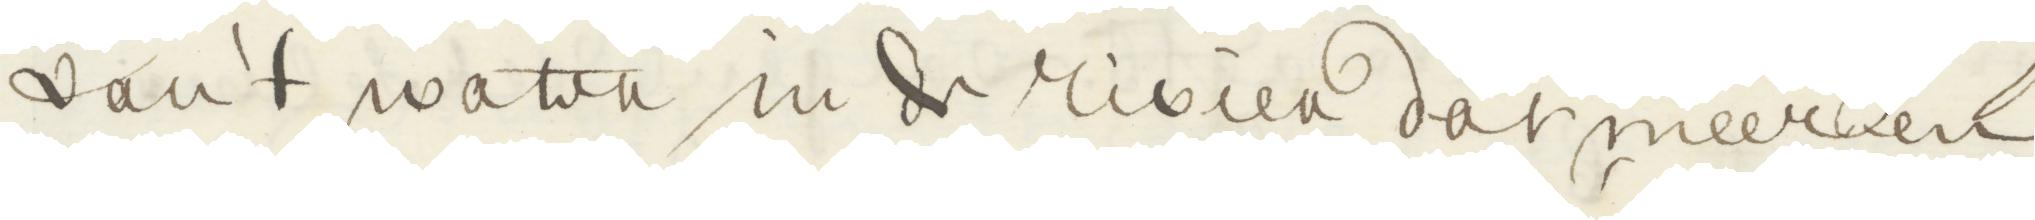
van ’t water in de rivier dat meer en
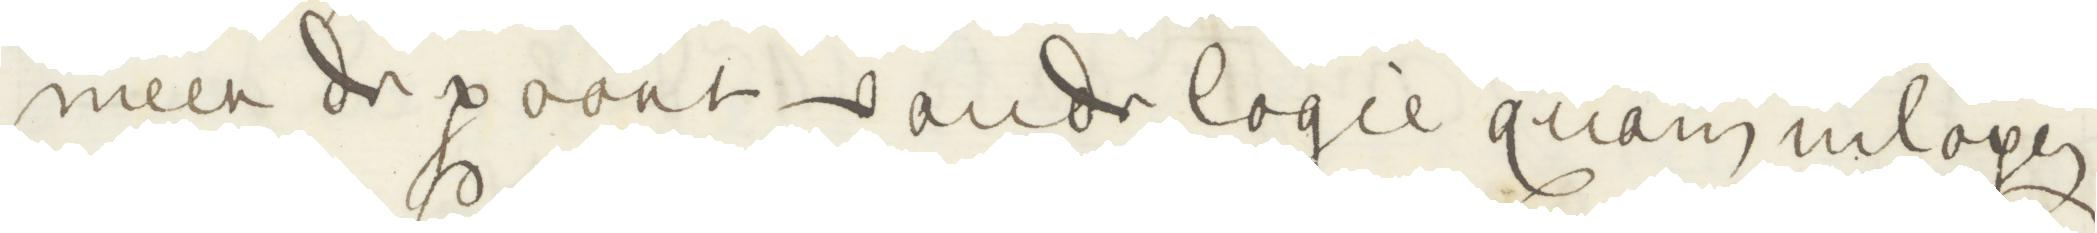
meer de poort vande logie quam inlopen
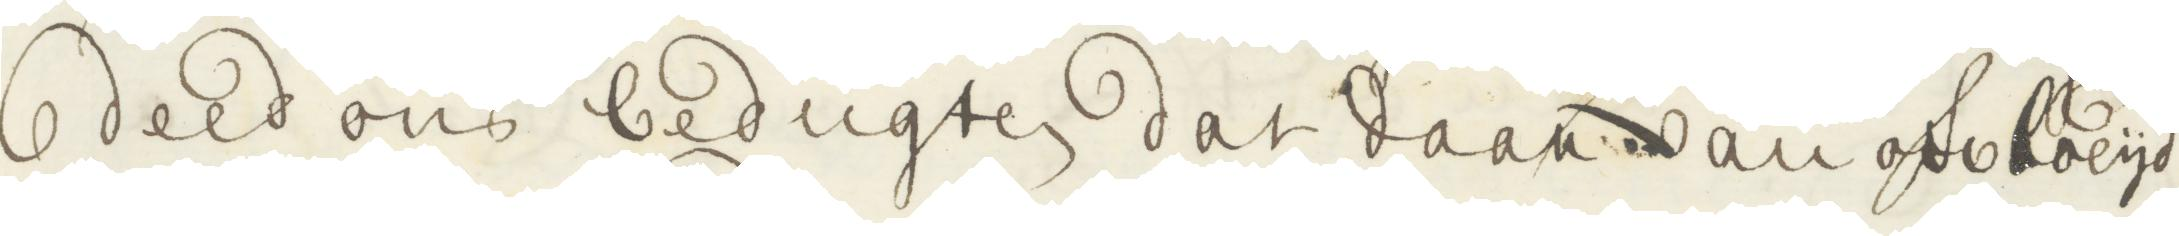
deed ons bedugten dat daar van overvloeijd
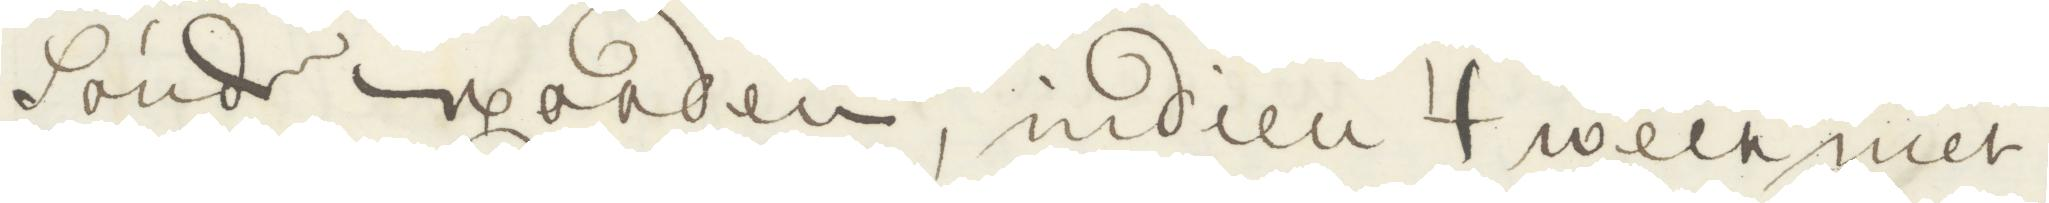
soude worden, indien ’t weer niet
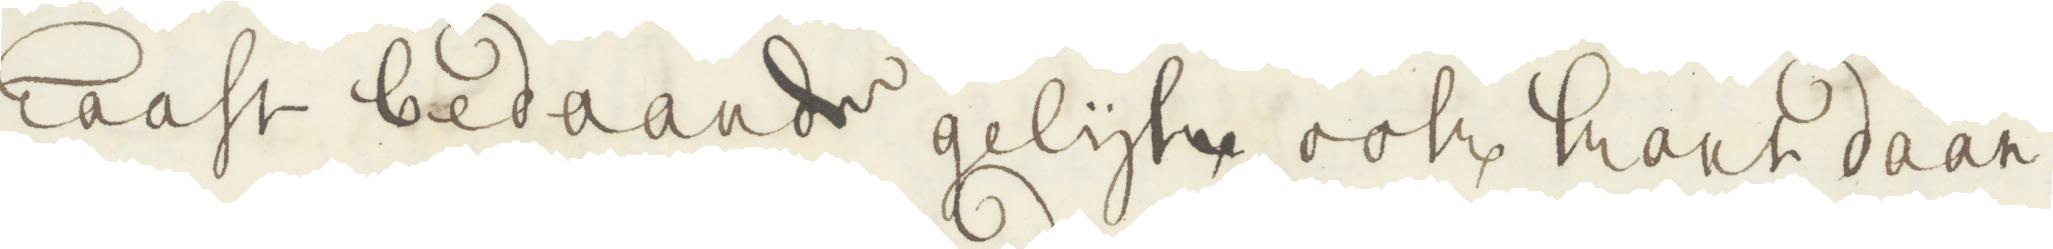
haast bedaarde gelijk ook kort daar
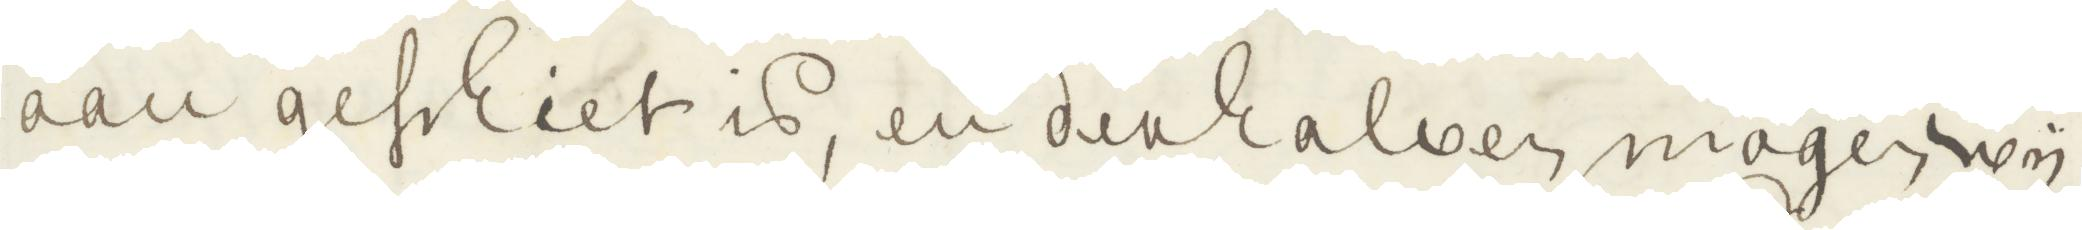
aan geschiet is, en derhalven mogen wij
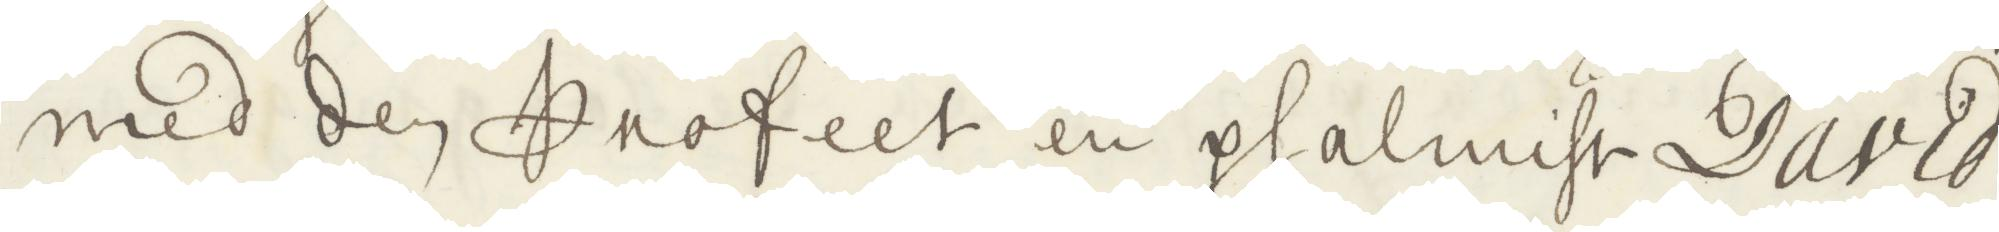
med den Profeet en psalmist David
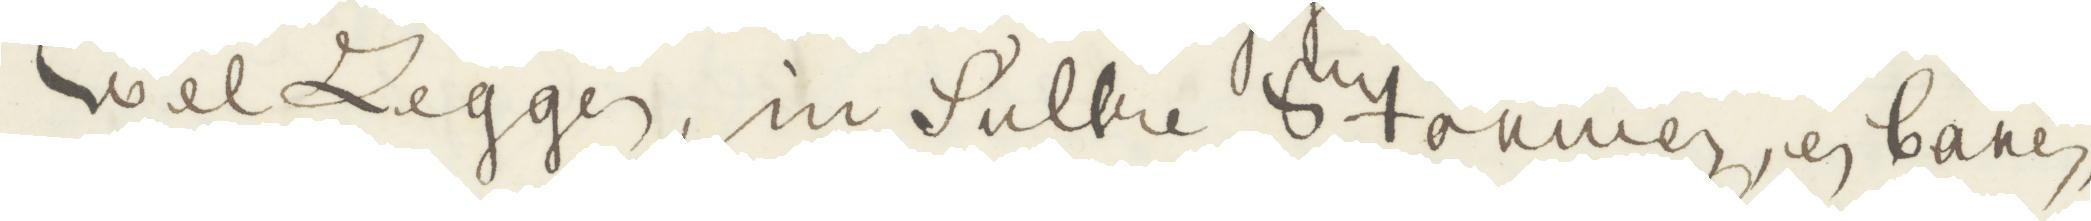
wel zeggen, in sulke stormen, en baren,
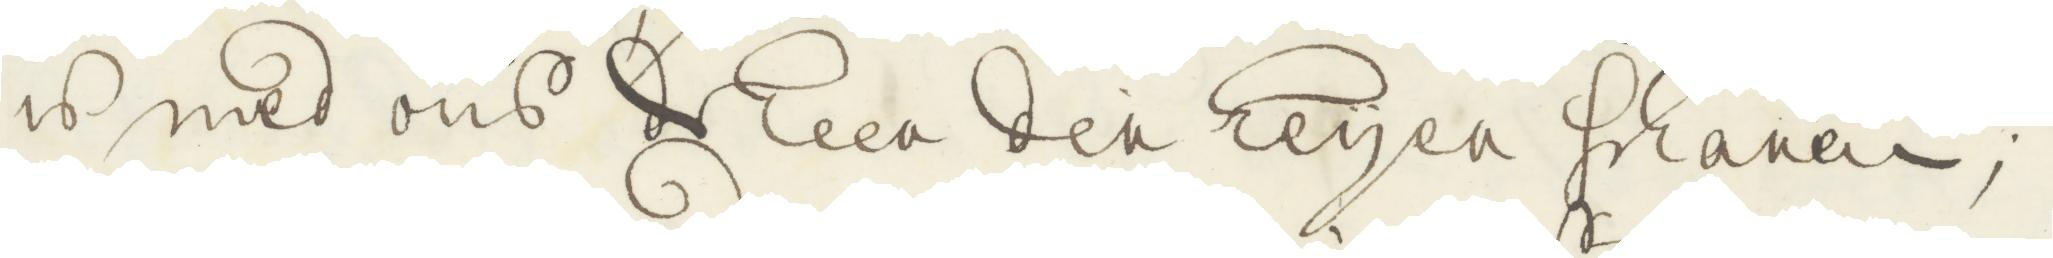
is med ons de Heer der Heijer scharen;
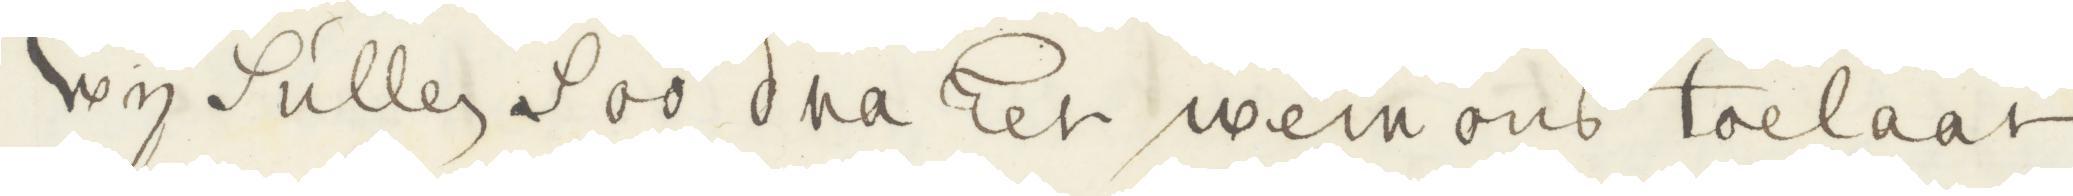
wij sullen soo dra het weir ons toelaat
